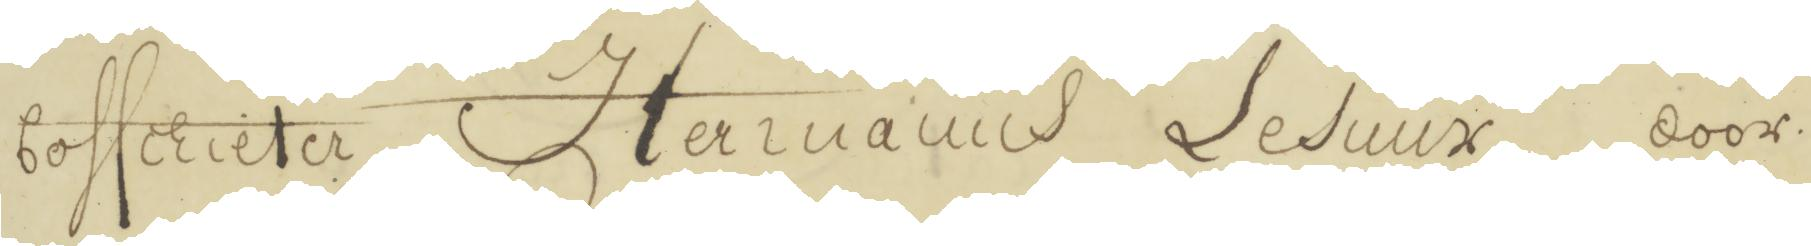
bosschieter Hermanus Lesuur door
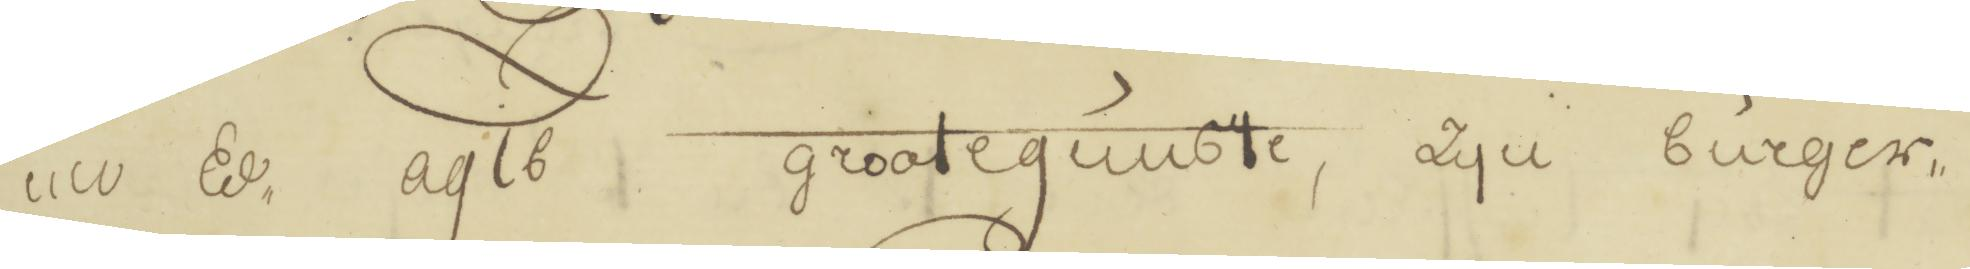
uw Ed„ agtb grootegunste, zyn burger„
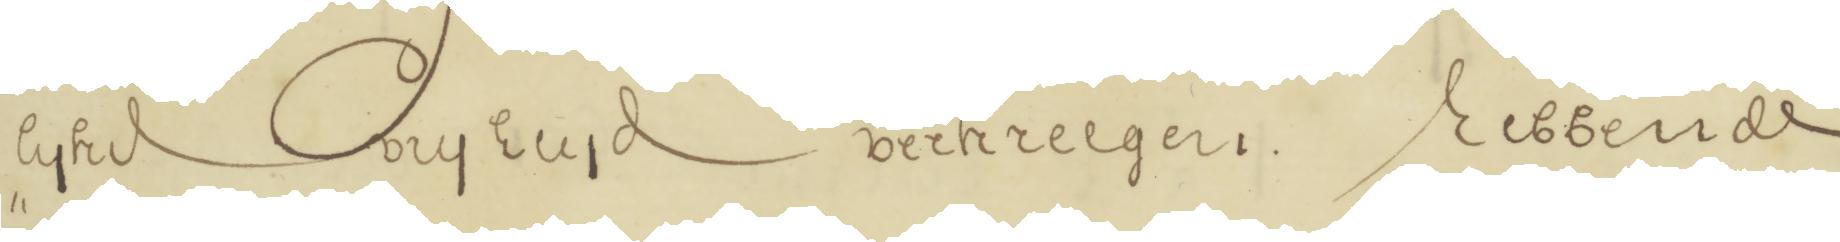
„lyke vryheyd verkreegen hebbende
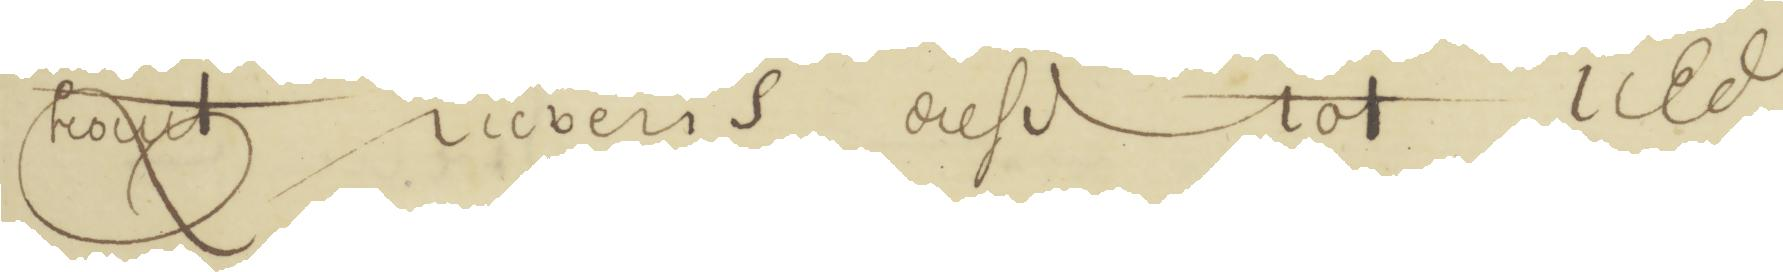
komt nevens dese tot UEd
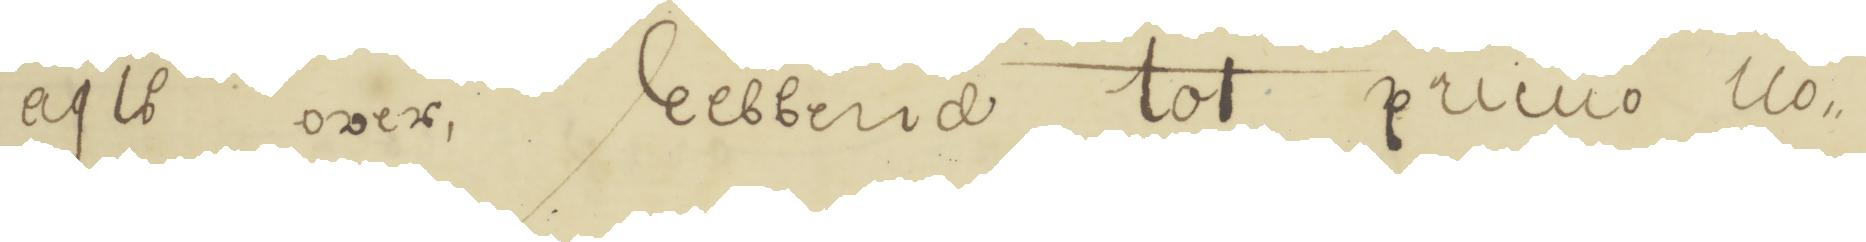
agtb over, hebbende tot primo no„
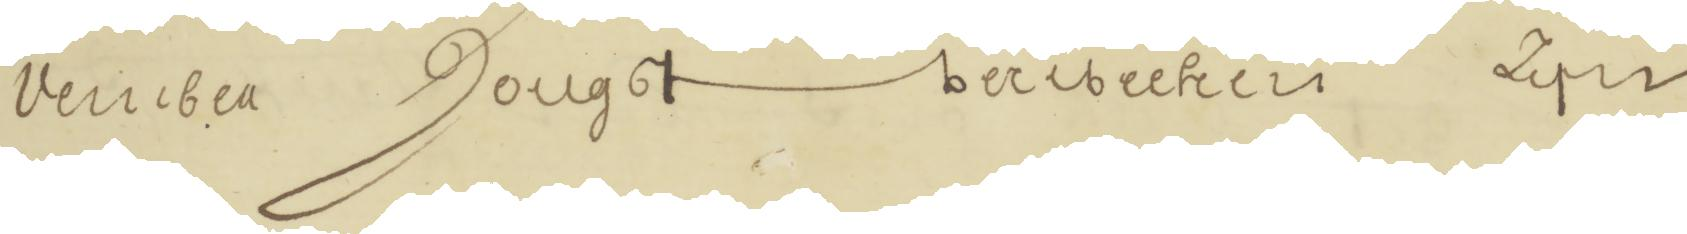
vember Jongst verweeken zyn
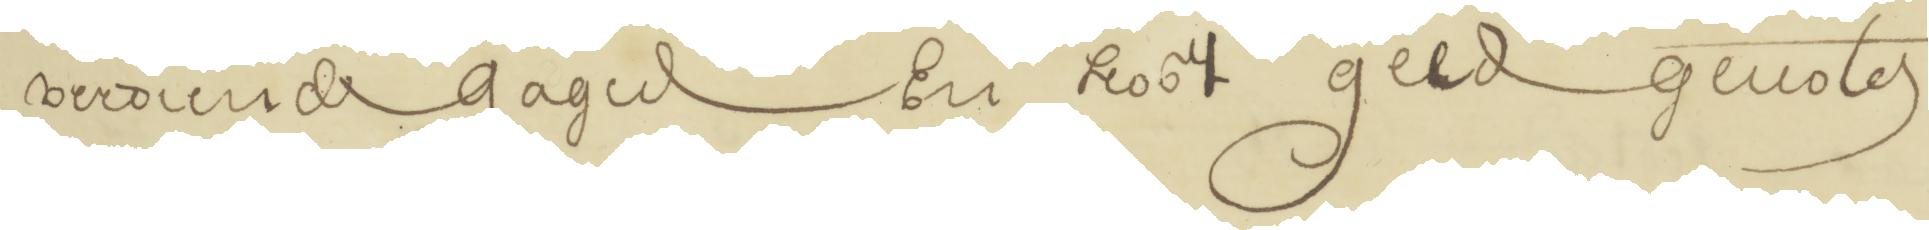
verdiende gagie En kost geld genoten
